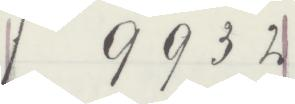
ƒ 9932
